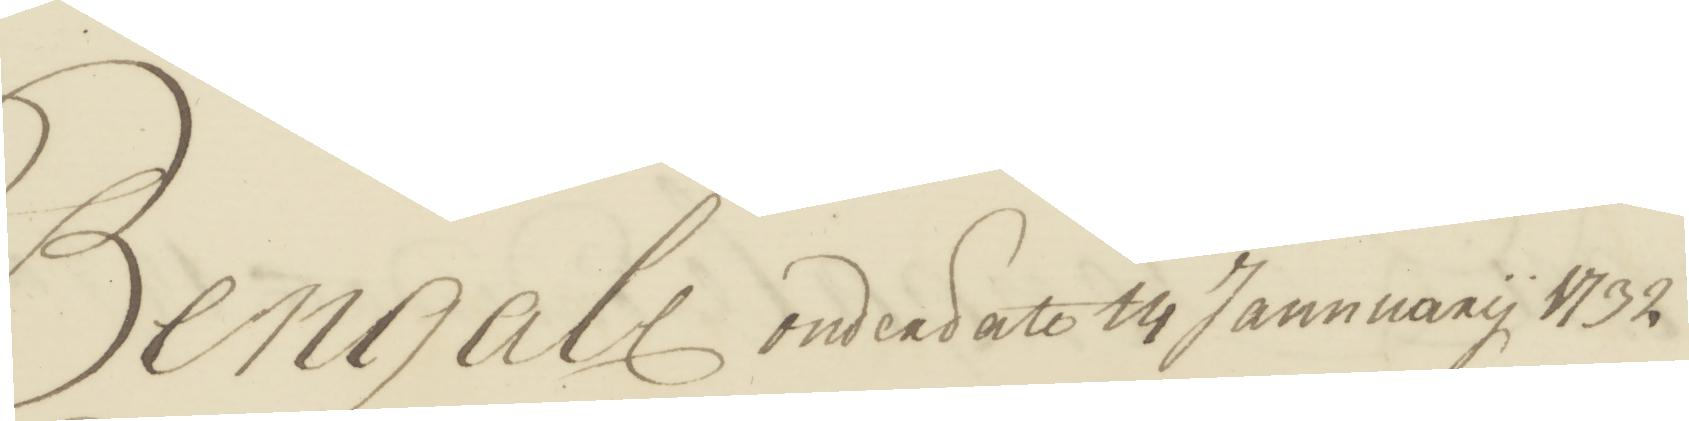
Van Bengale onder dato 14 Januarij 1732.
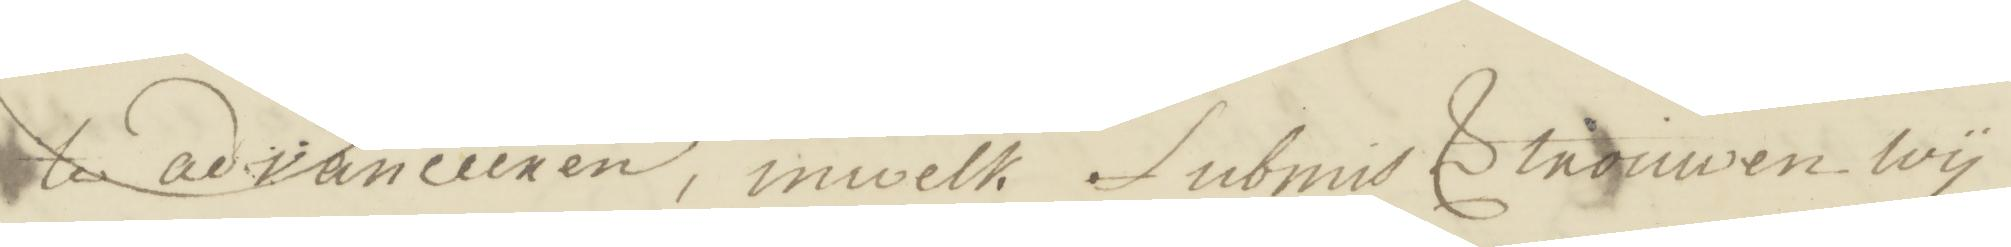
te advanceeren, inwelk Submis Vertrouwen wij
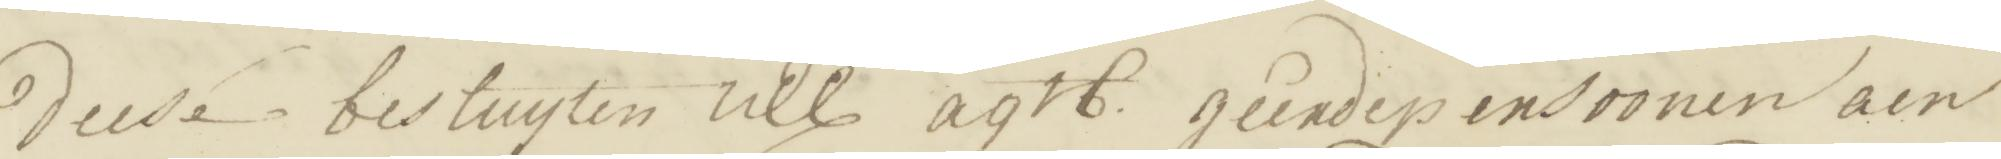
deese besluyten uEE agtb: geerde persoonen aen
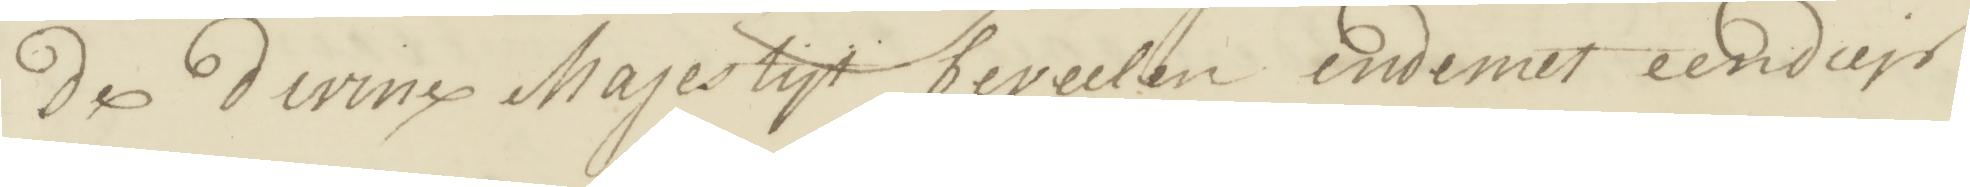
de divine Majestijt beveelen ende met een diep
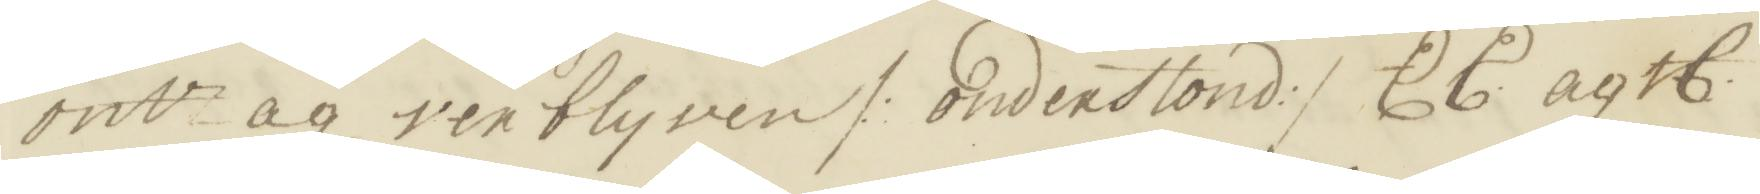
ontzag verblyven /:onderstond:/ E E: agtb:
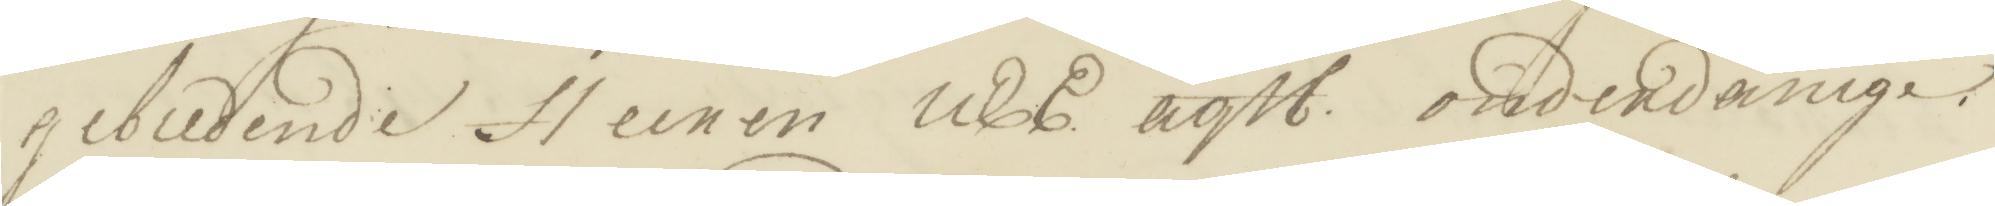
gebiedende Heeren UEE: agtb. onderdanige:
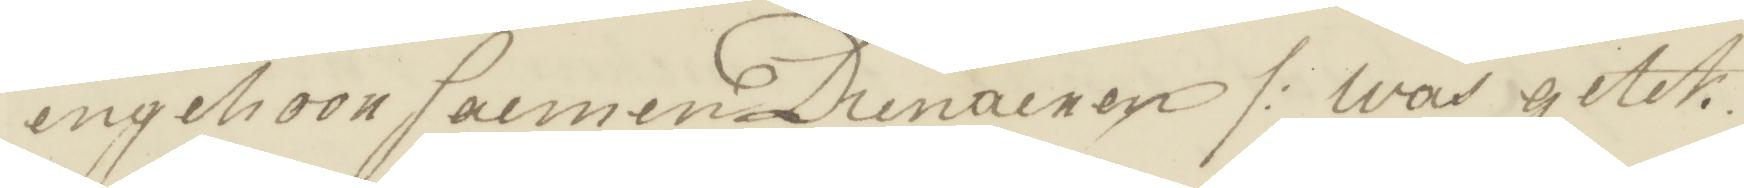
engehoor saemen Dienaeren /: was getek.
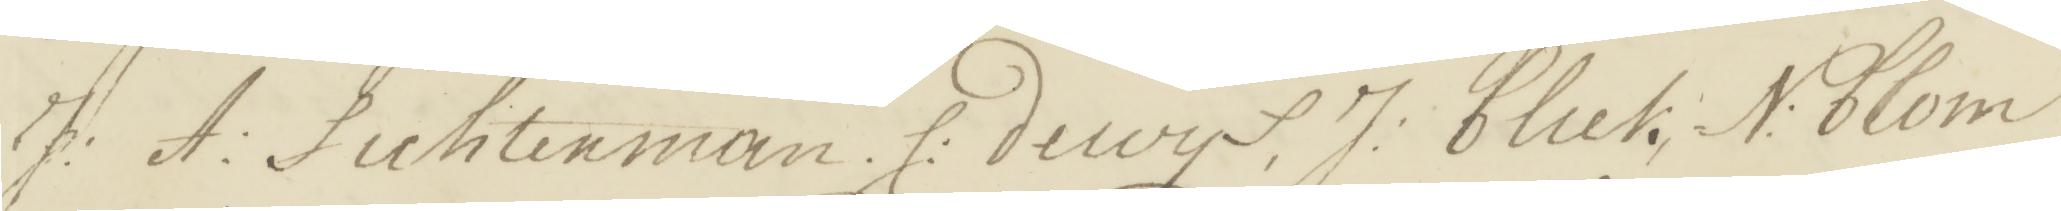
J: A: Sichterman . C: dewys, J: bliek N: blom
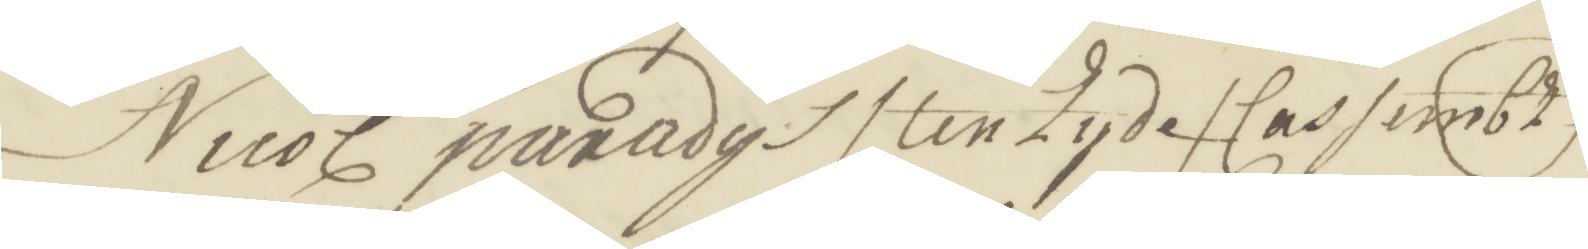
Nicol paradijs / ter Zyde Cassembz
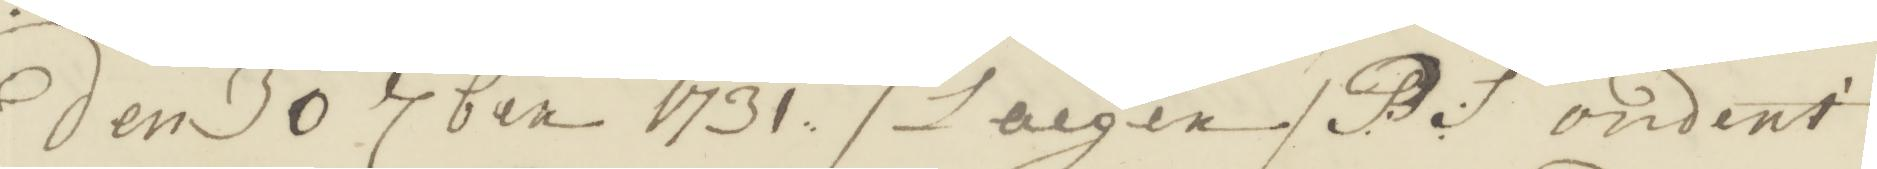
den 30 7ber 1731: /Laeger/ P:S: ondert
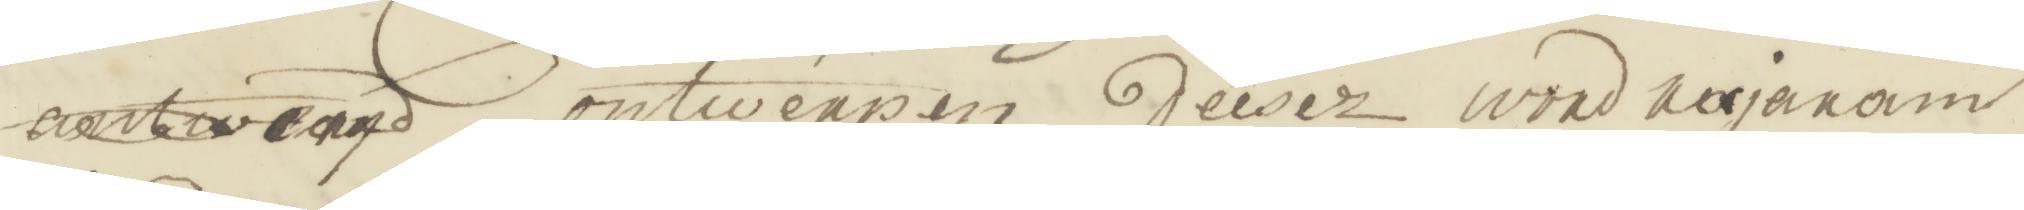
antwerpd ontwerpen deesez word rajaram
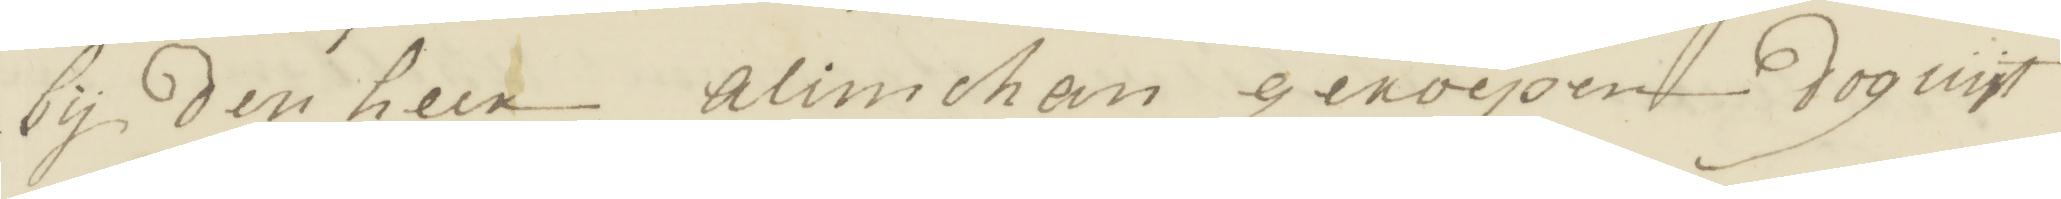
bij den heer alimchan geroepen dog uijt
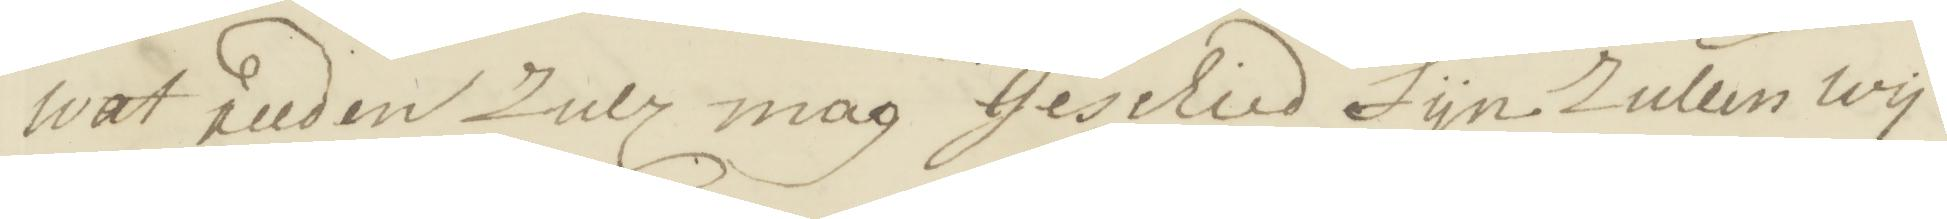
wat reeden Zulx mag geschied Sijn Zullen wij
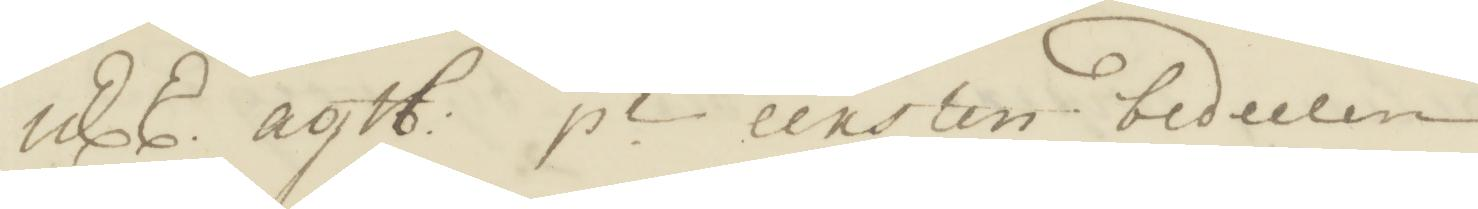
UU E: agtb: p=r eersten bedeelen
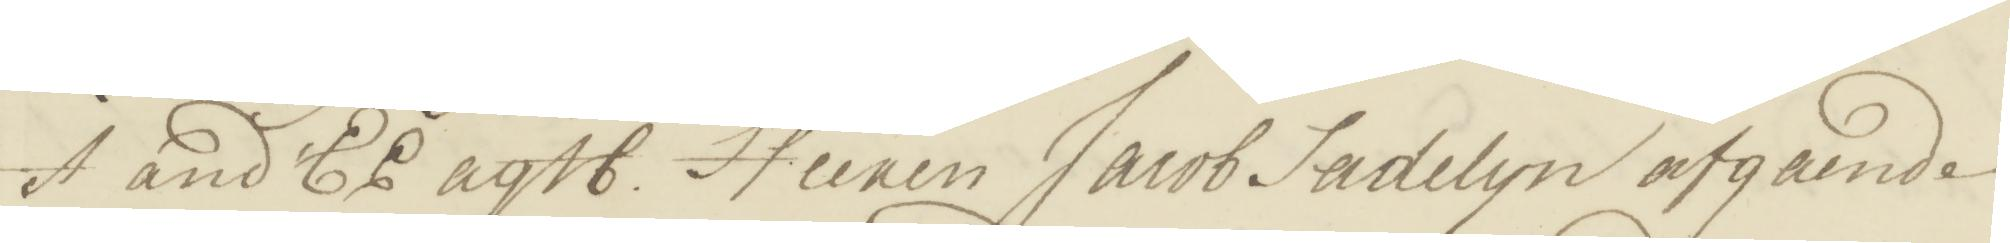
Aand EE agtb: Heeren Jacob Sadelyn afgaende
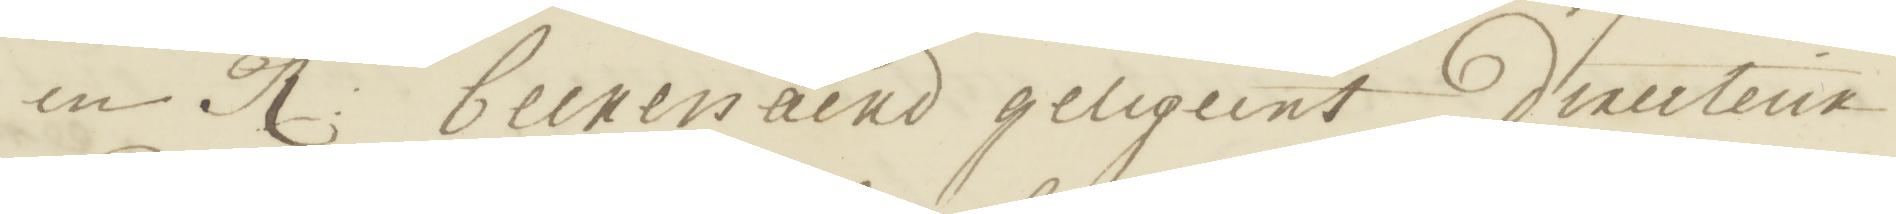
en R: beerenaerd geligeert directeur
